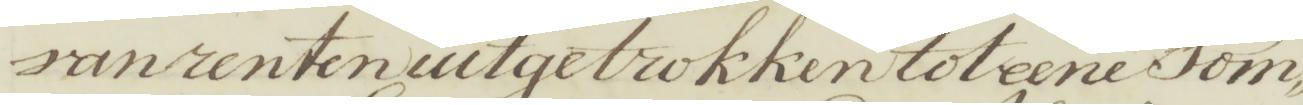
van renten uitgetrokken tot eene Som„
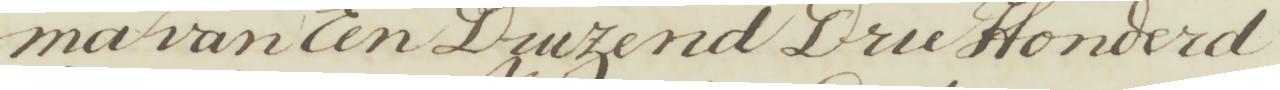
ma van een Duizend Drie Honderd
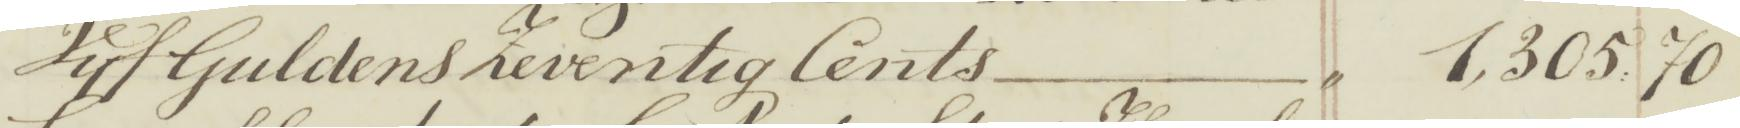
Vyf Guldens Zeventig Cents — „ 1,305:70
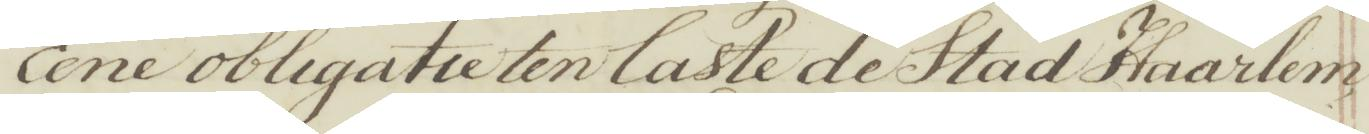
Eene obligatie ten laste de Stad Haarlem
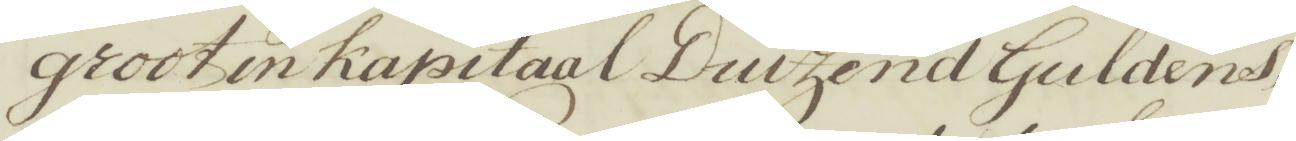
groot in Kapitaal Duizend Guldens,
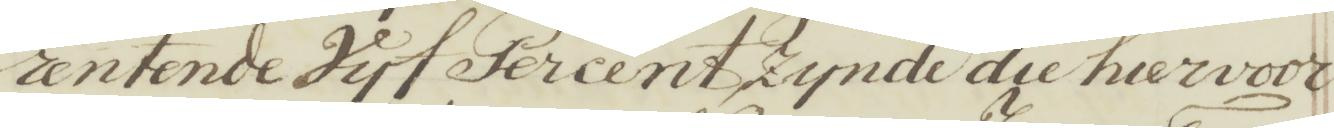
rentende Vyf Percent, zynde die hiervoor
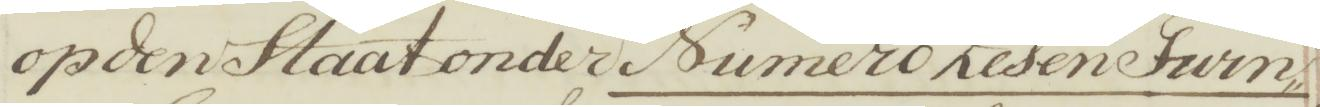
op den Staat onder Numero Zesen Twin„
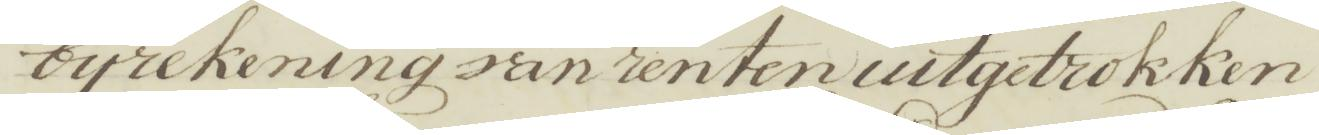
byrekening van renten uitgetrokken
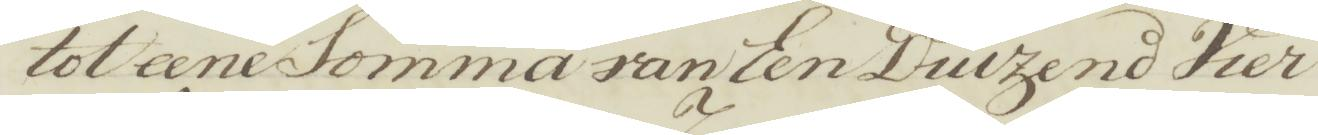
tot eene Somma van Een Duizend Vier
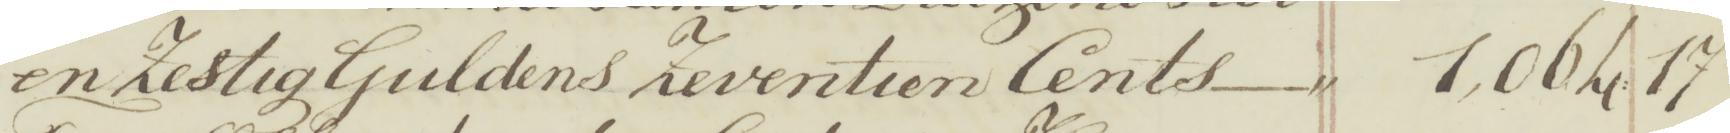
en Zestig Guldens Zeventien Cents — „1.064:17
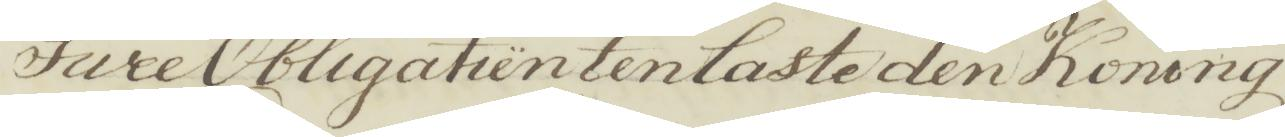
Twee Obligatien ten laste den Koning
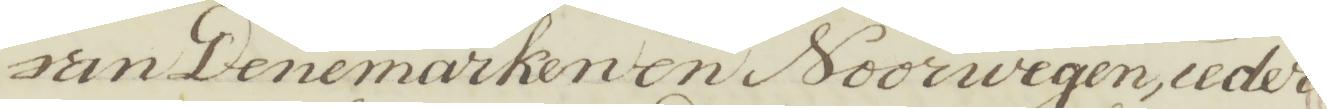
van Denemarken en Noorwegen, ieder
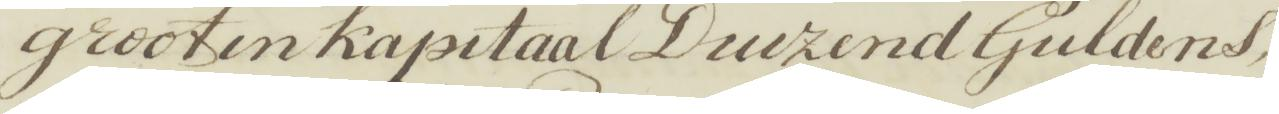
groot in kapitaal Duizend Guldens,
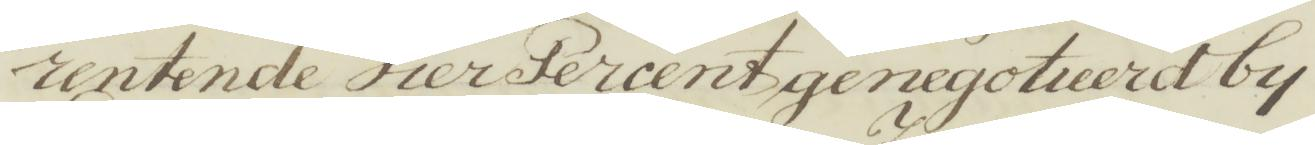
rentende vier Percent genegotieerd by
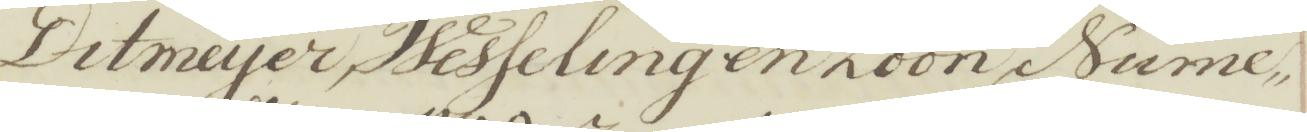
Ditmeyer, Wesseling en Zoon, Nume„
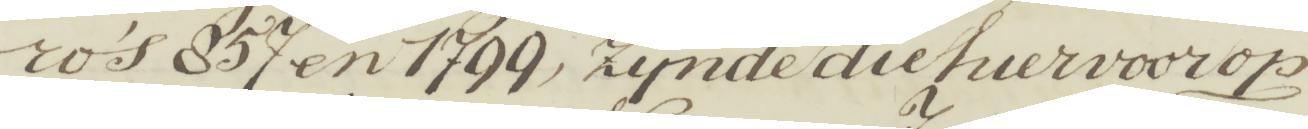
ro's 857 en 1799, zynde die hiervoor op
